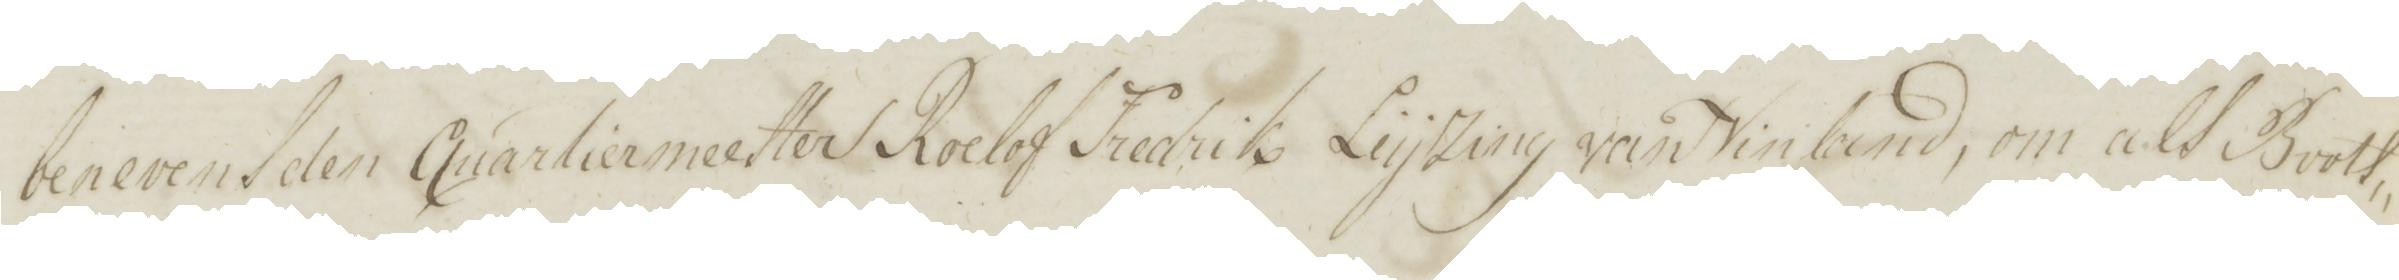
benevens den quartiermeester Roelof Fredrik Leijzing van Vinland, om als Boots„
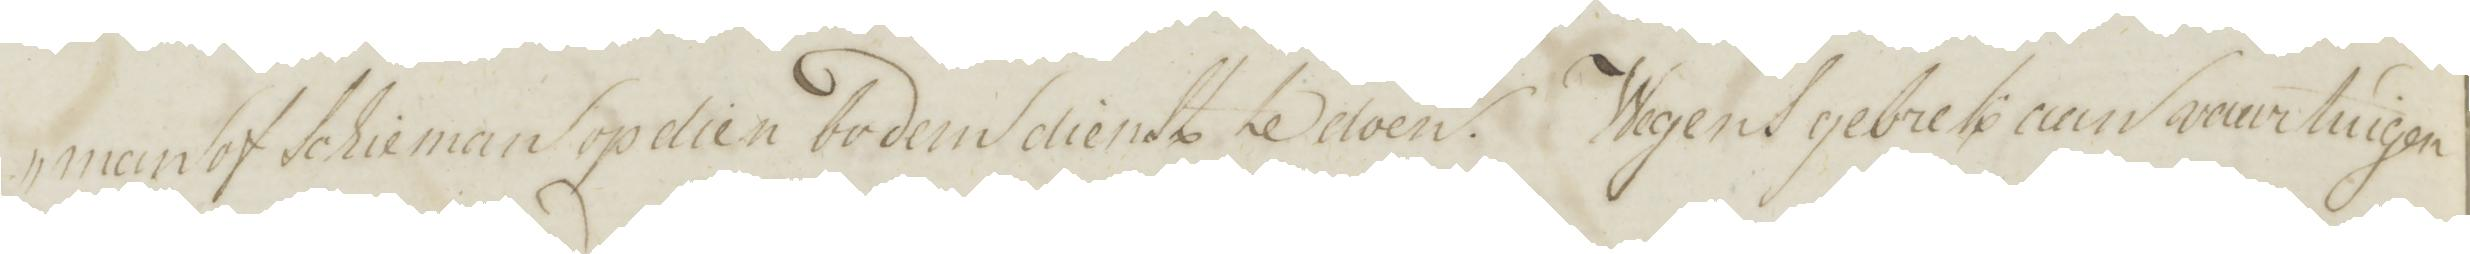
„man of Schieman op dien bodem dienst te doen. Wegens gebrek aan vaartuigen
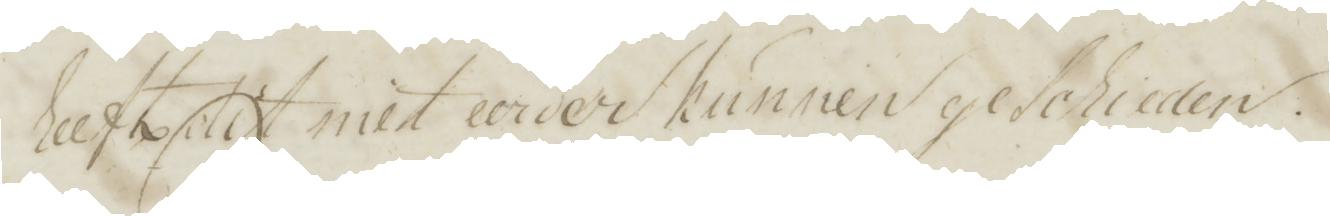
heeft dit niet eerder kunnen geschieden.
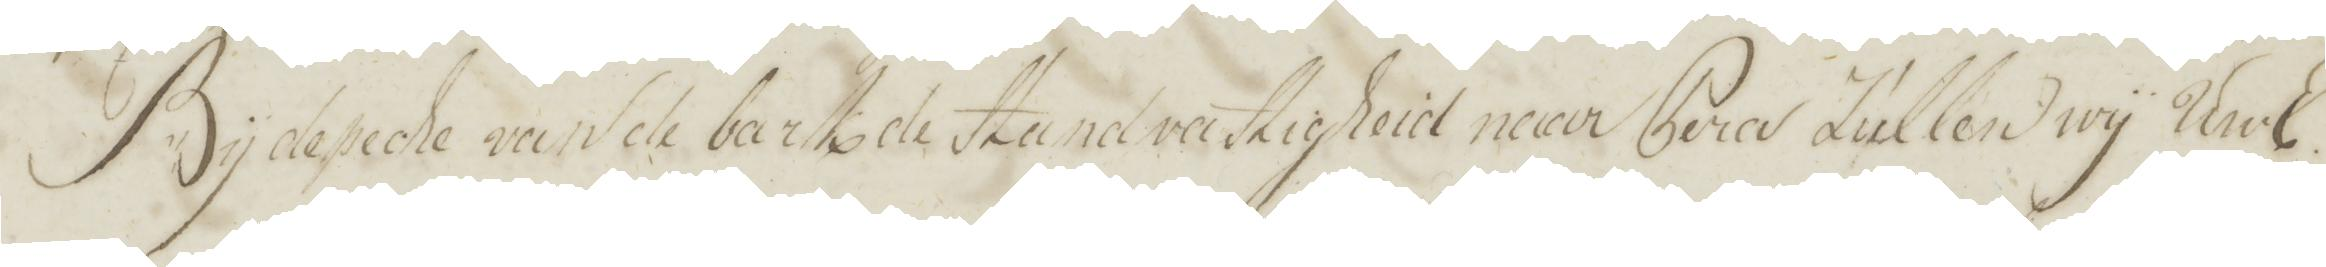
Bij depeche van de bark de Standvastigheid naar Pera Zullen wij uw E.
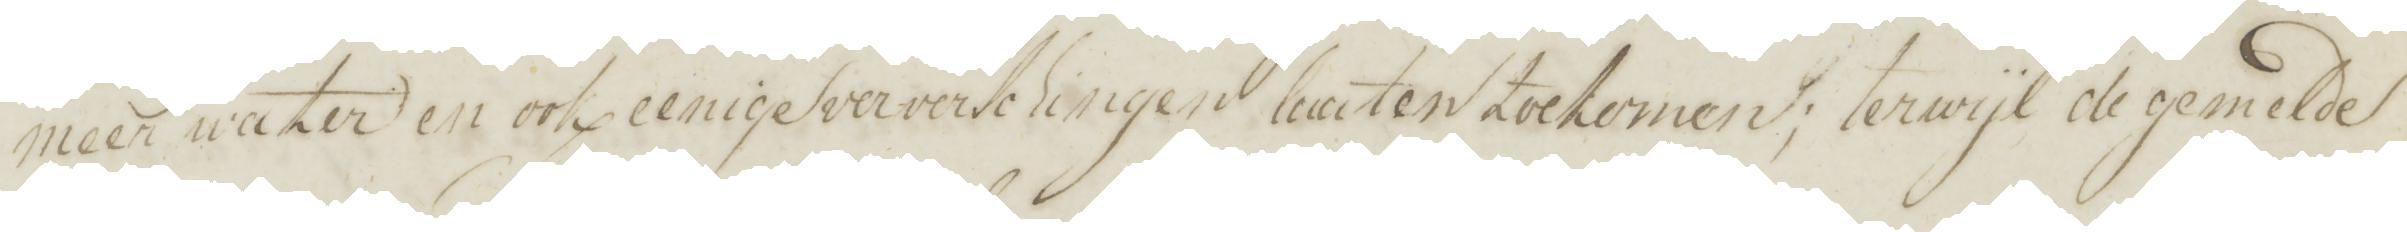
meer water en ook eenige ververschingen laaten toekomen; terwijl de gemelde
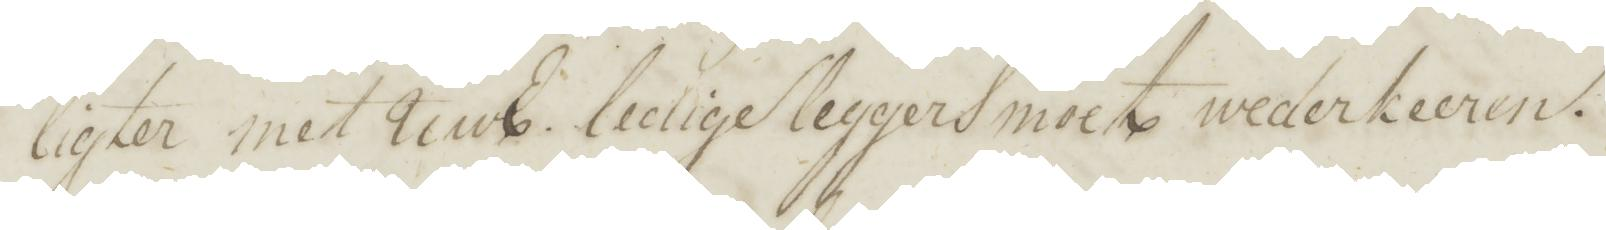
ligter met uwE. ledige leggers moet wederkeeren.
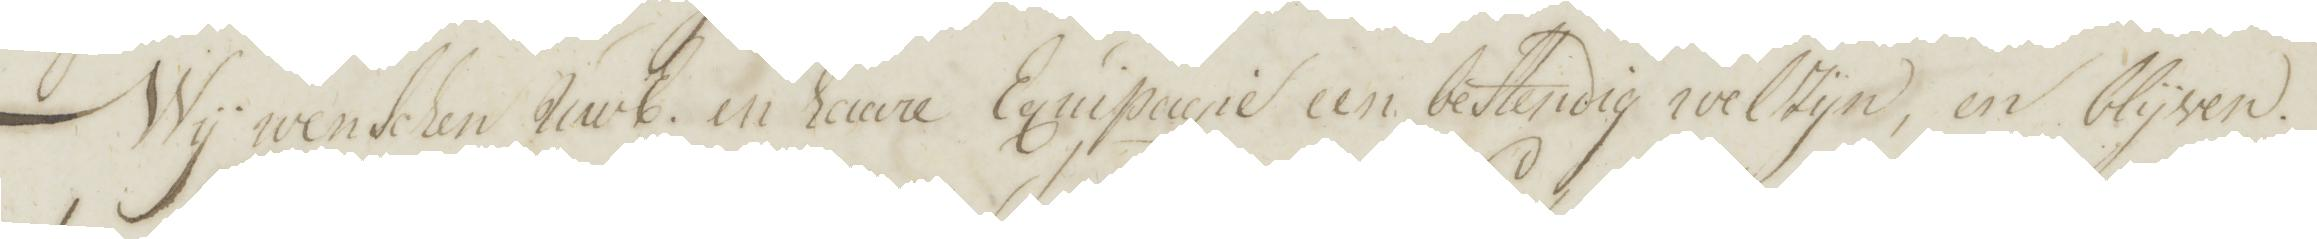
Wij wenschen uwE. en haare Equipagie een bestendig welzijn, en blijven.
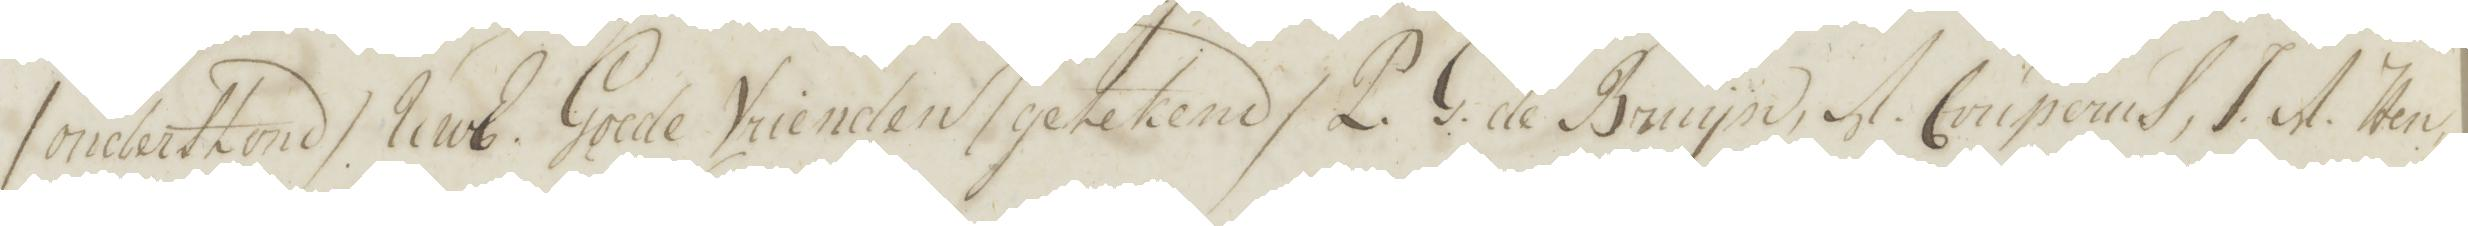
/onderstond / uwE. Goede Vrienden /getekend/ P. G. de Bruijn, A. Couperus, I. A: Hen„
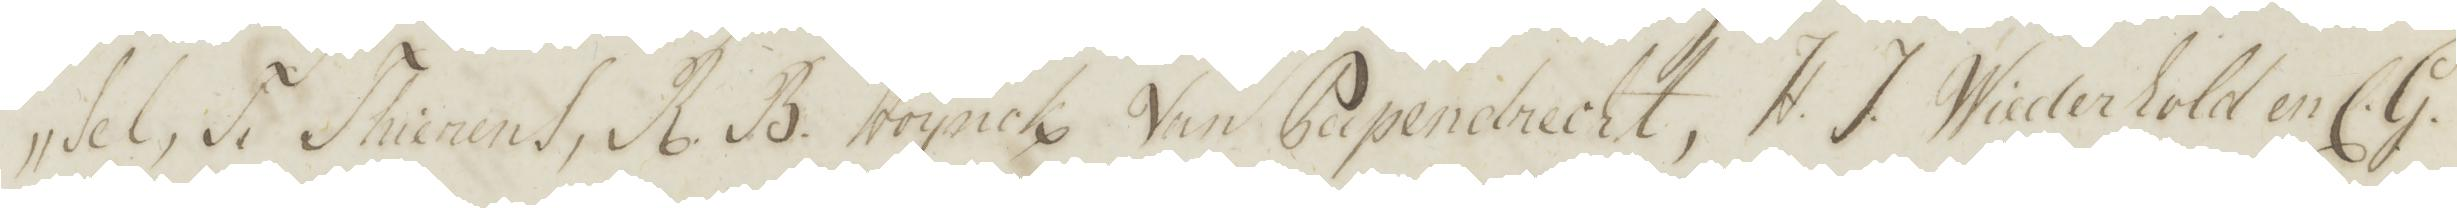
„sel, F. Thierens, R. B. Hoijnck Van Papendrecht, H: I: Wiederhold en C. G.
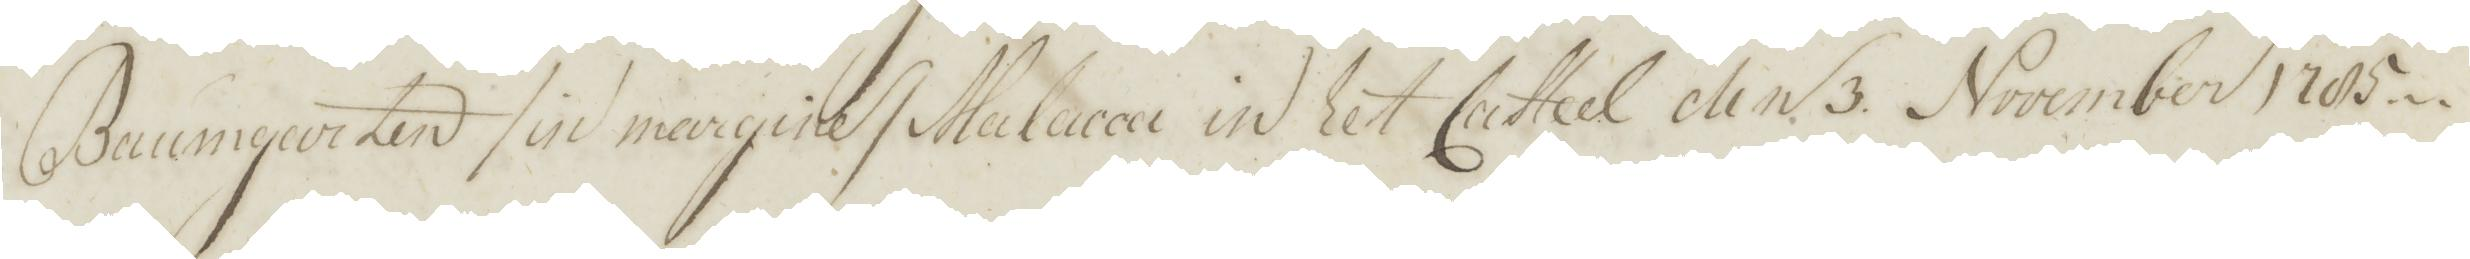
Baumgarten / in margine / Malacca in het Casteel den 3. November 1785. ~
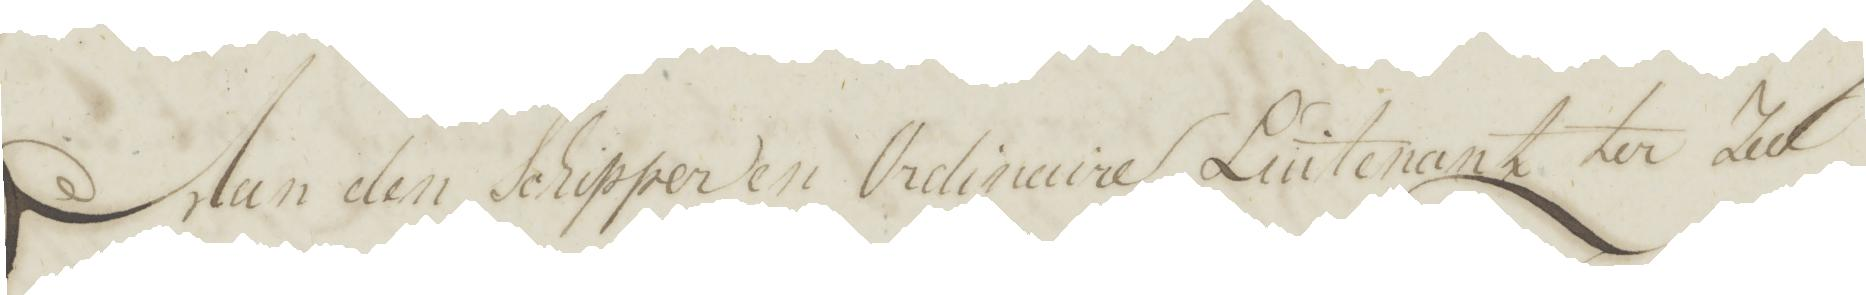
Aan den schipper en Ordinaire Luitenant ter Zee
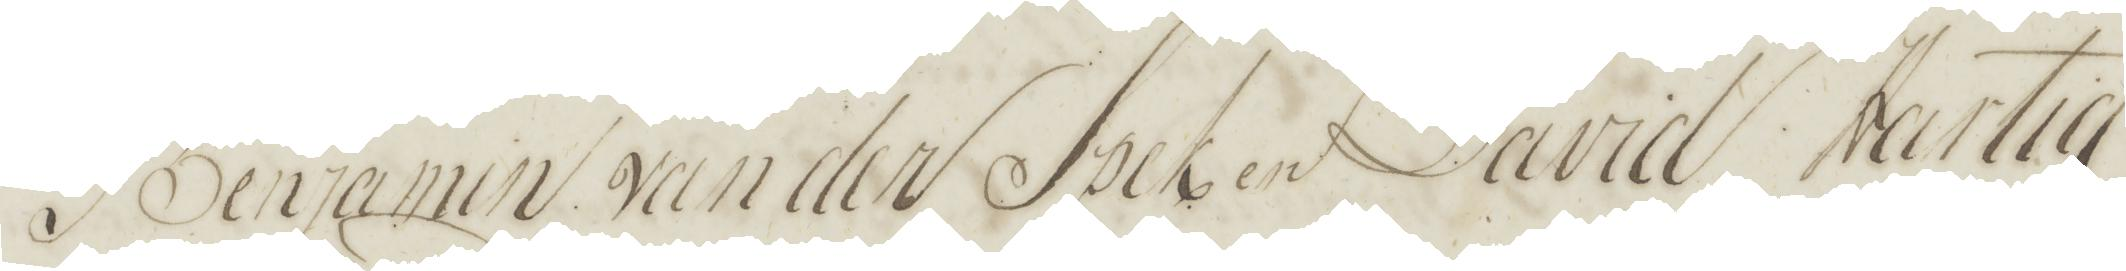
Benjamin van der Spek en David Hartig
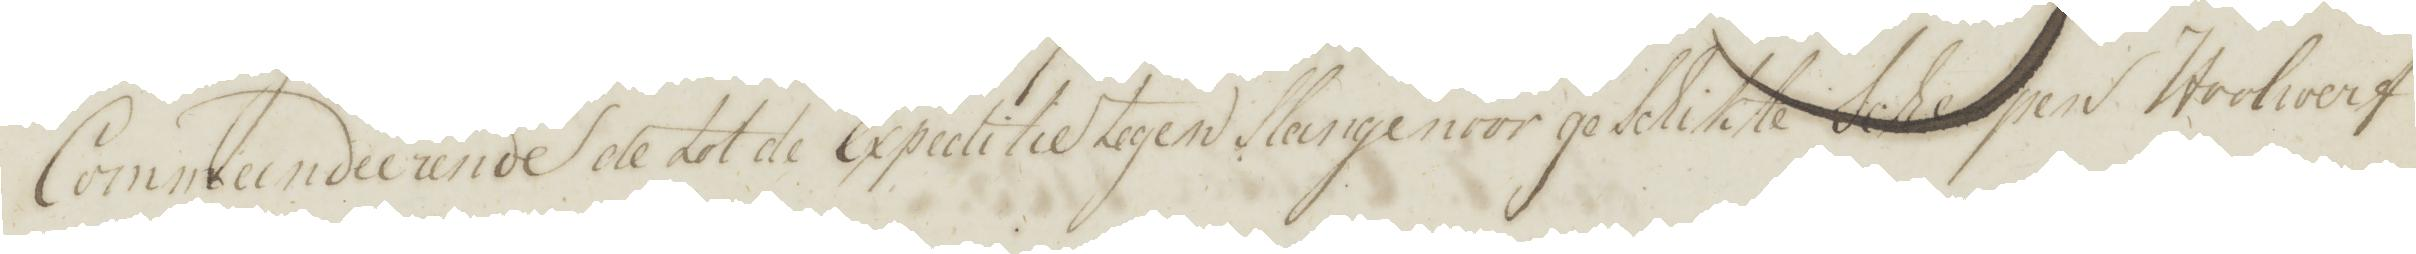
Commandeerende de tot de Expeditie tegen Slangenoor geschikte Schepen Hoolwerf
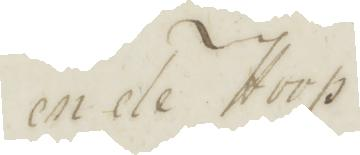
en de Hoop
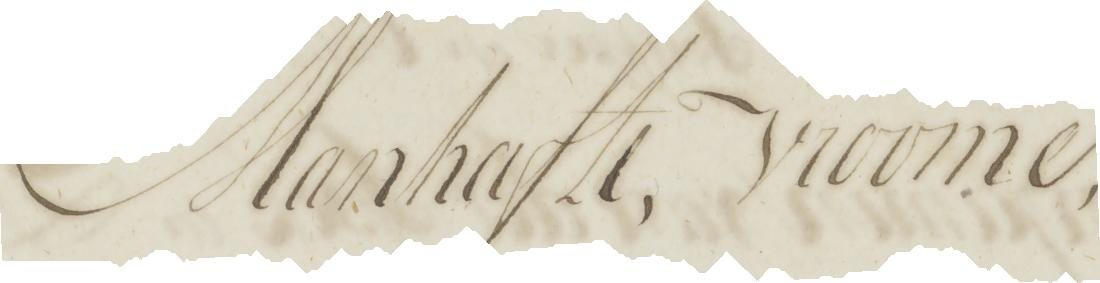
Manhafte, Vroome,
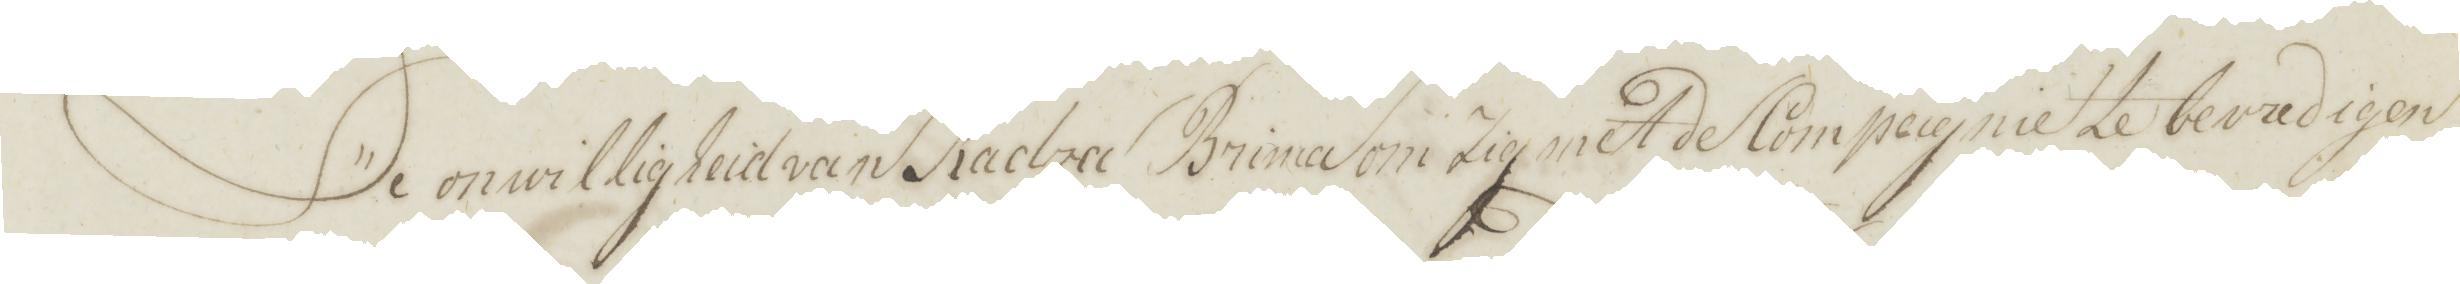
De onwilligheid van Radja Brima om zig met de Compagnie te bevredigen
